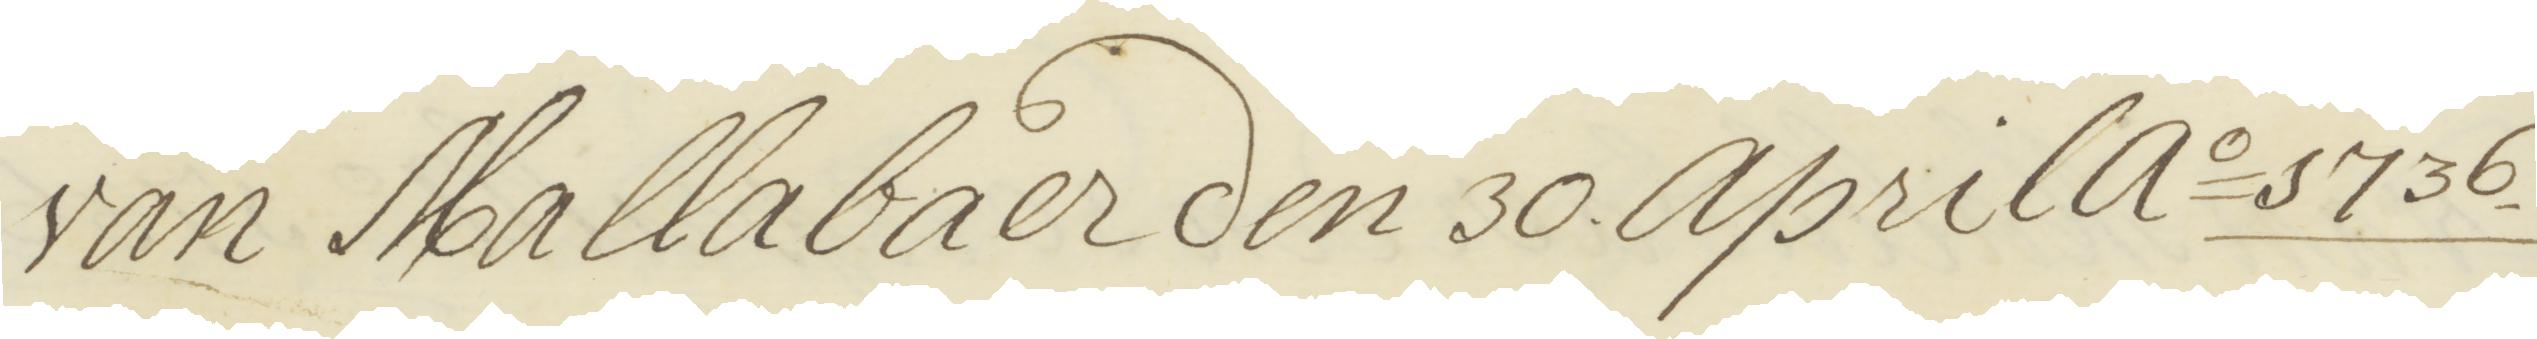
van Mallabaer den 30. April A=o 1736.
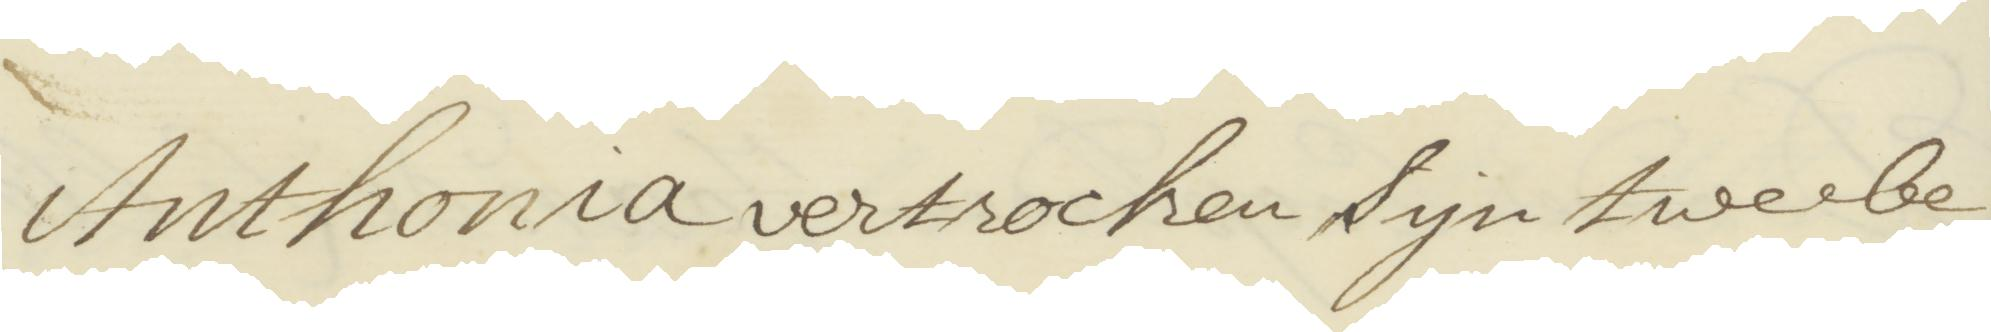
Anthonia vertrocken sijn twee be
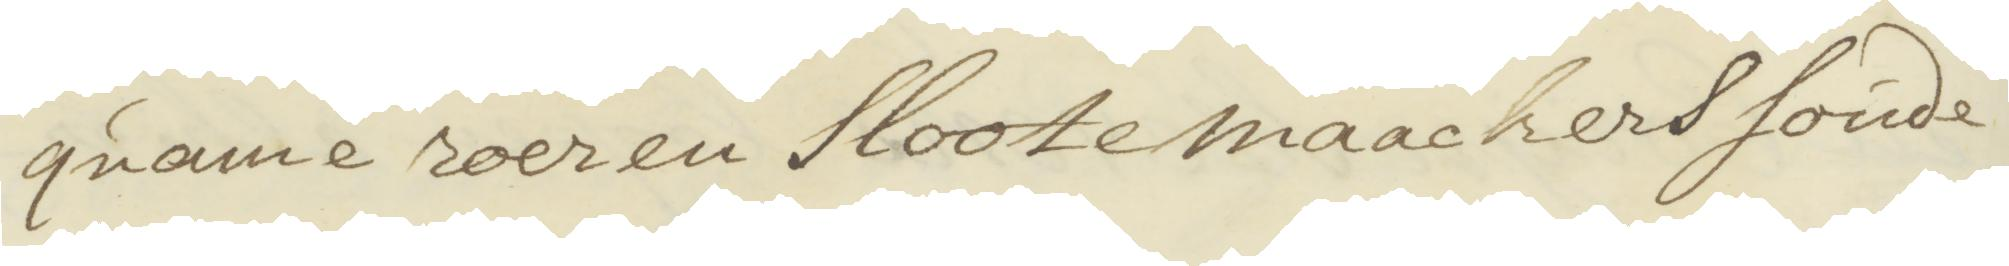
quame roeren sloote maackers soude
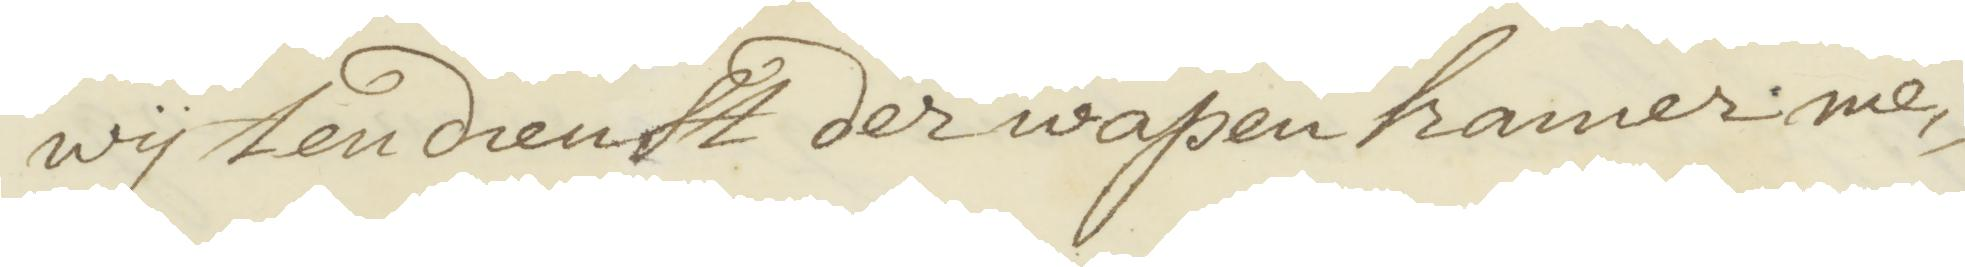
wij ten dienst der wapen kamer me„
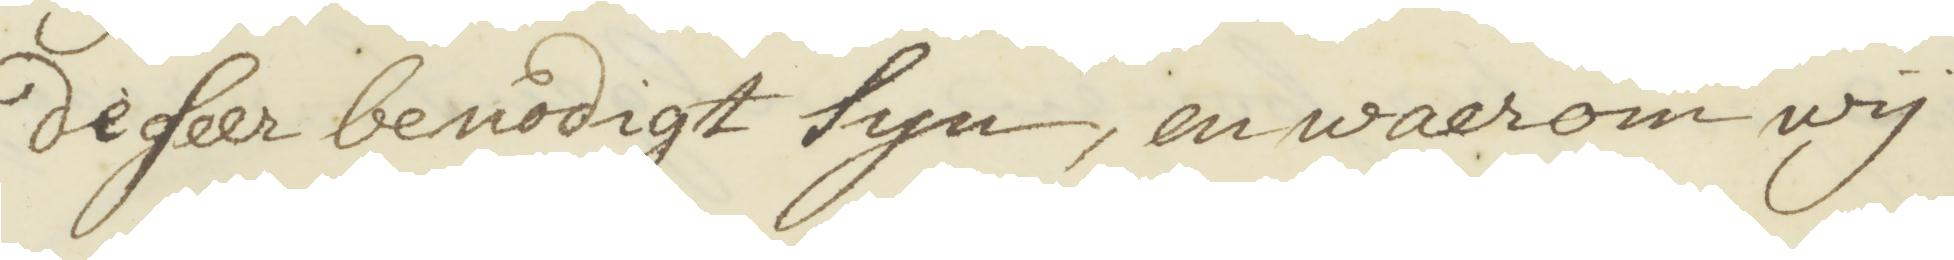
de seer benodigt sijn, en waerom wij
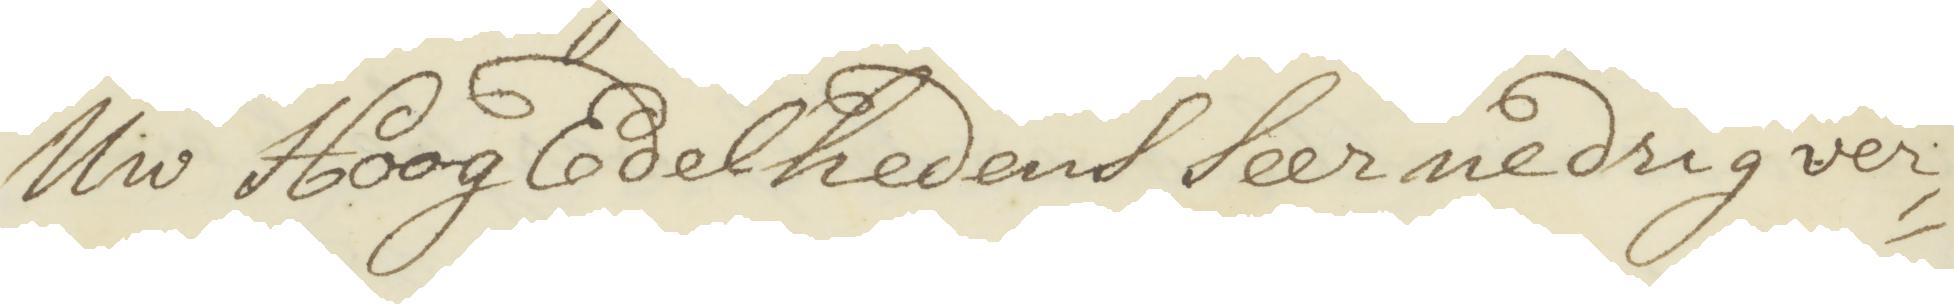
Uw Hoog Edelhedens seer nedrig ver„
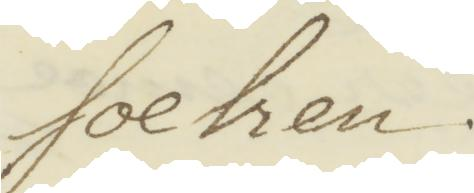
soeken.
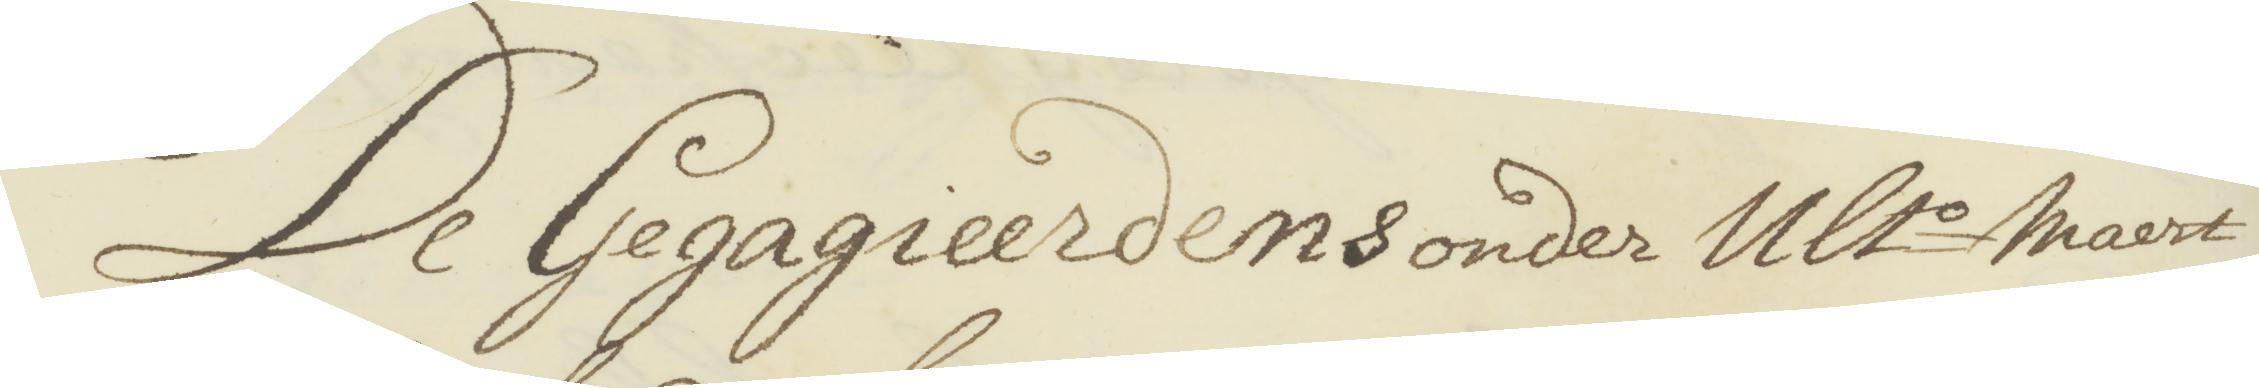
De Gegagieerdens onder Ult=o maert
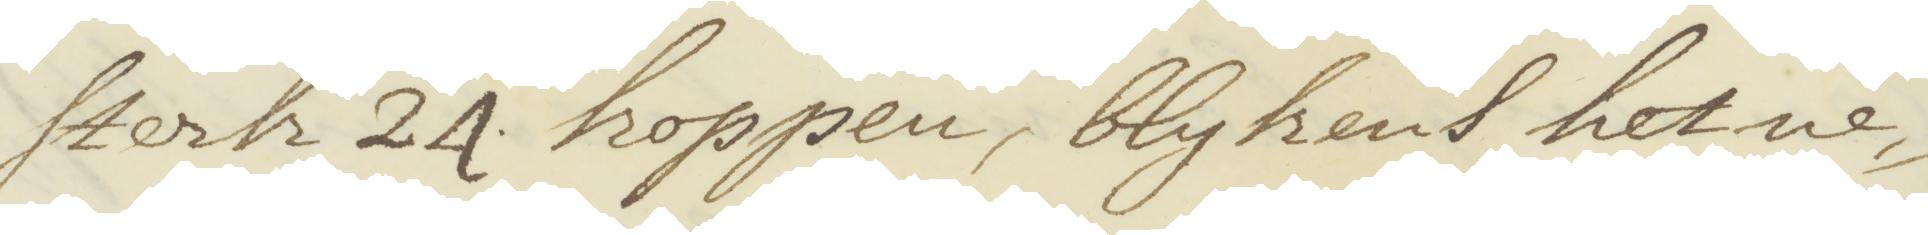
sterk 24. koppen, blijkens het ne„
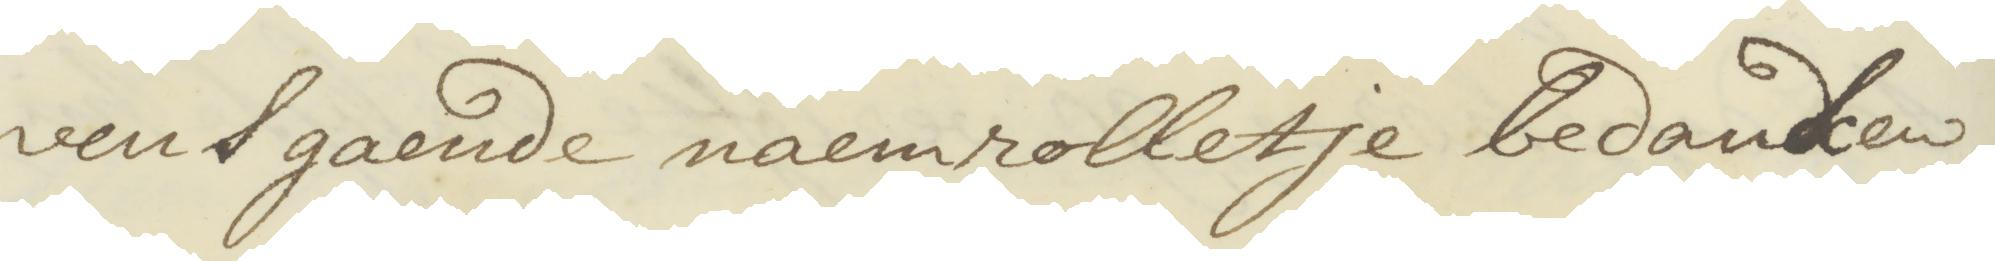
vens gaende naemrolletje bedanken
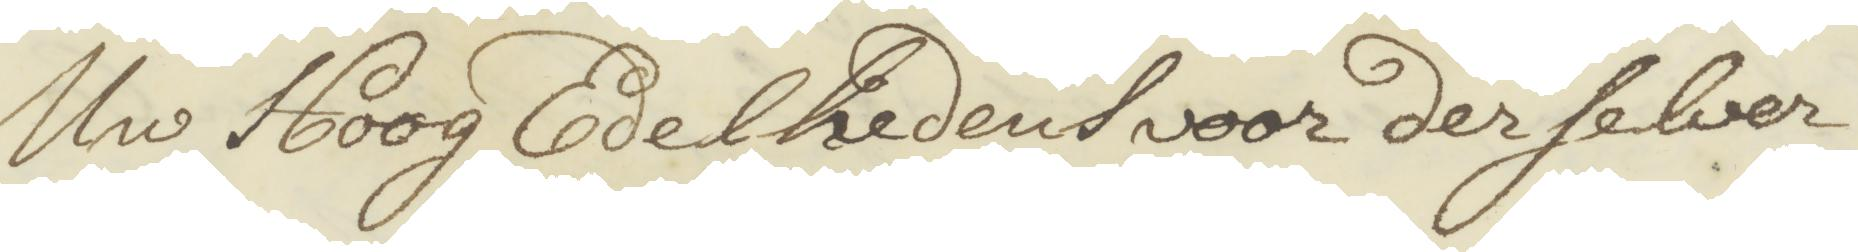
Uw Hoog Edelhedens voor derselver
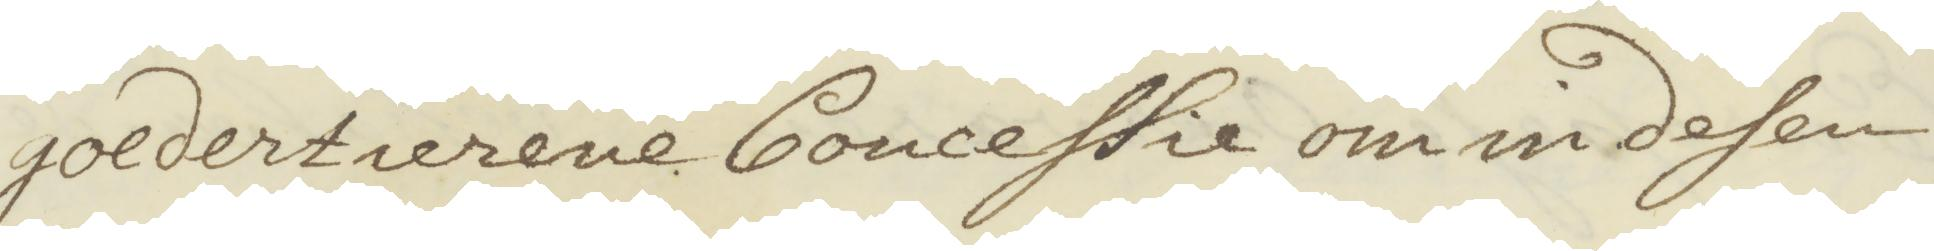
goedertierene Concessie om in desen
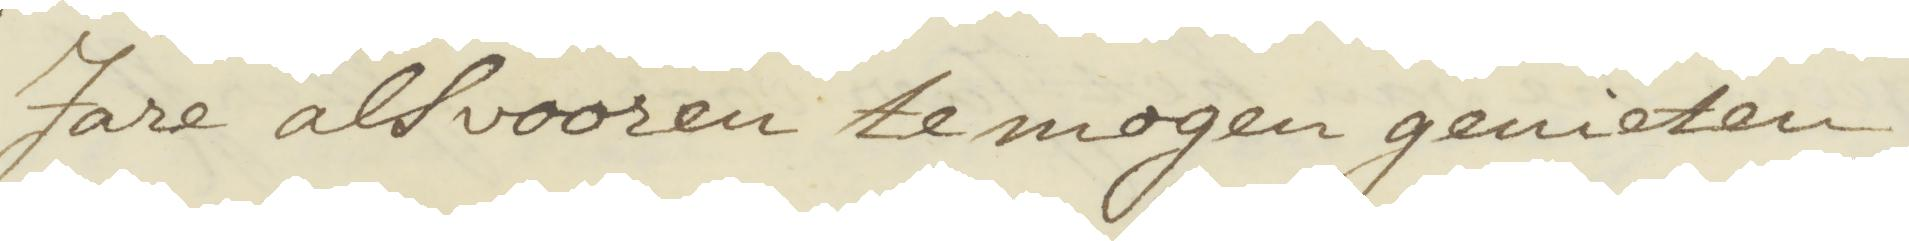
Jare als vooren te mogen genieten
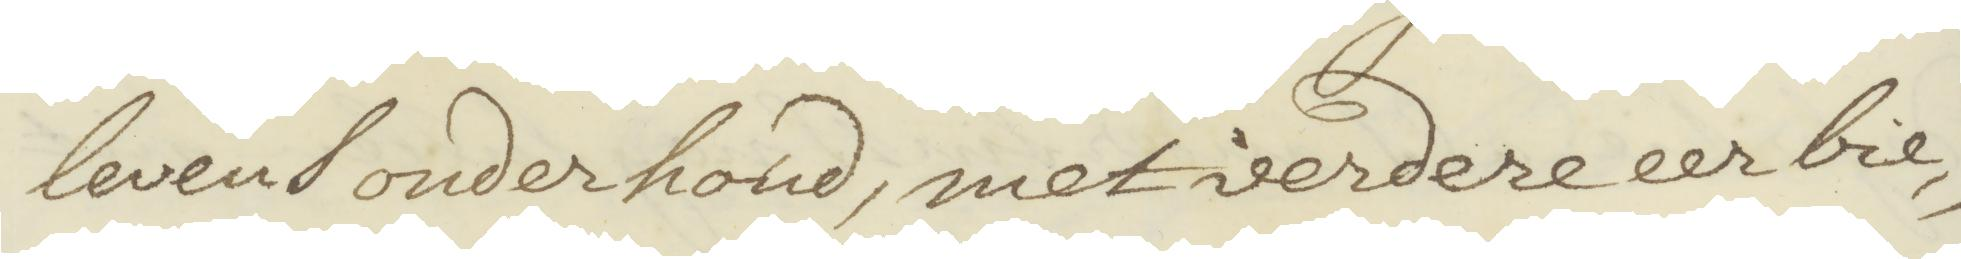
levens onderhoud, met verdere eer bie„
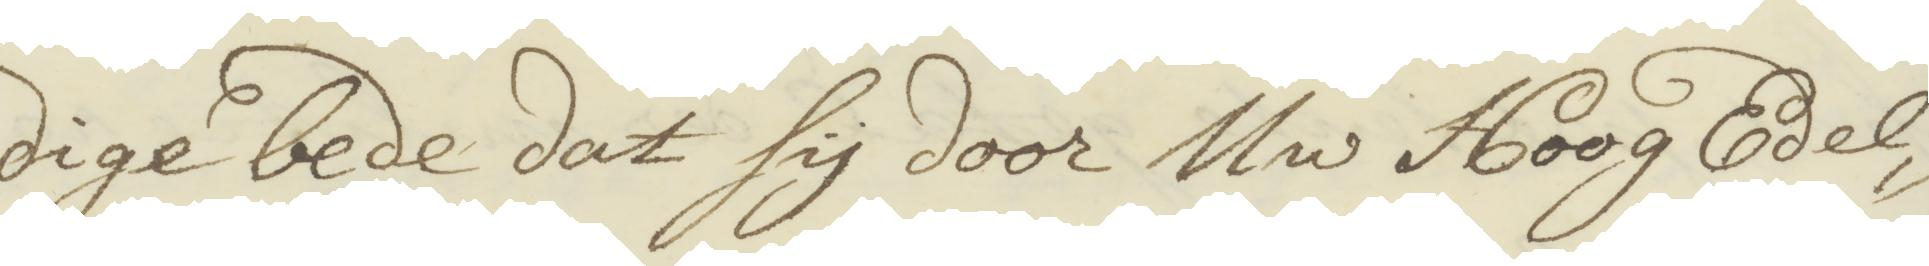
dige bede dat sij door Uw Hoog Edel„
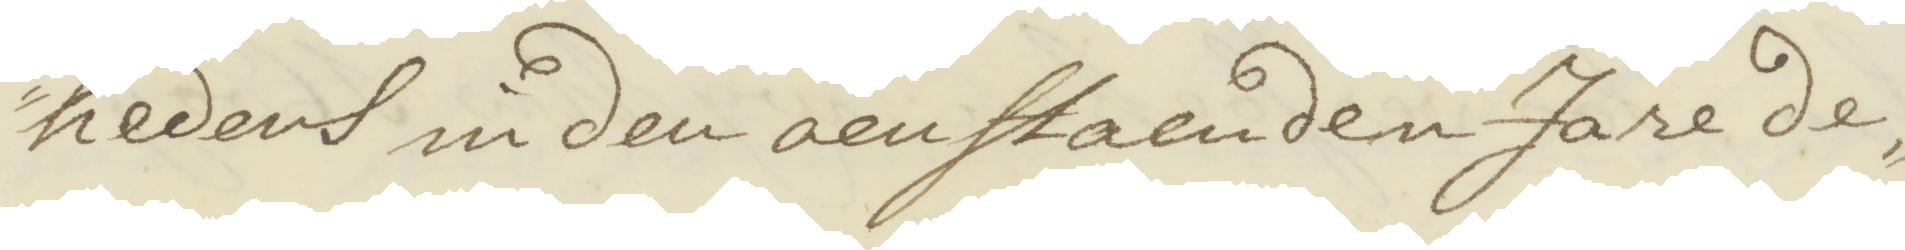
„hedens in den aenstaenden Jare de„
